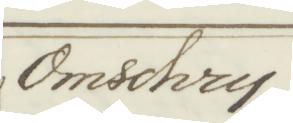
Omschry
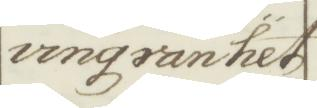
ving van het
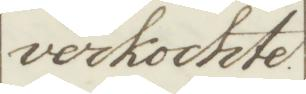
verkochte.
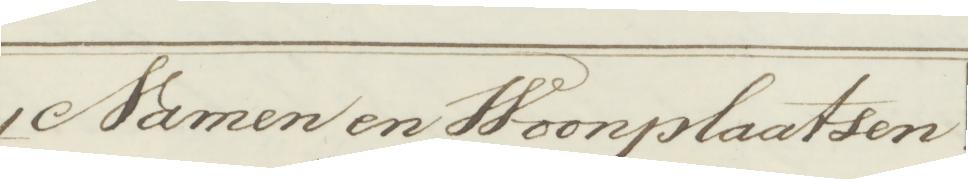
Namen en Woonplaatsen
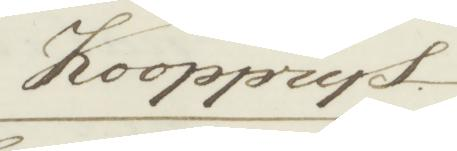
Koopprys.
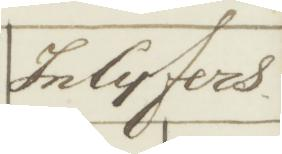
In Cyfers
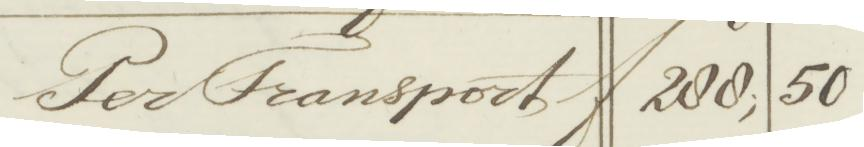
Per Transport ƒ 288; 50
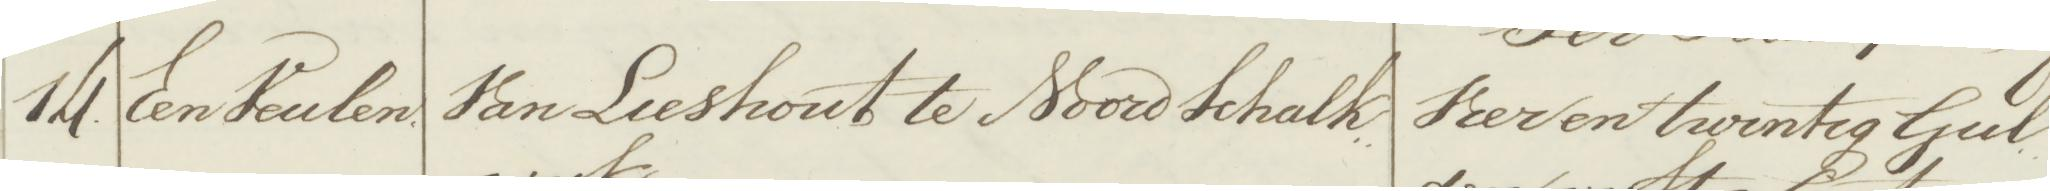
14. Een Veulen Van Lieshout te Noord schalk„ Vier en twintig Gul
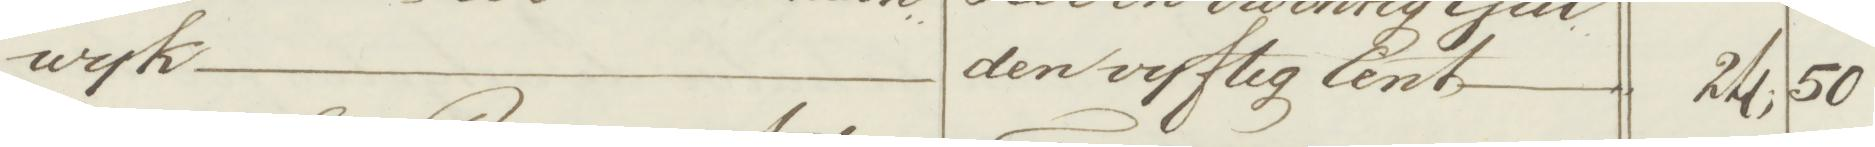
wyk den vyftig Cent „ 24; 50
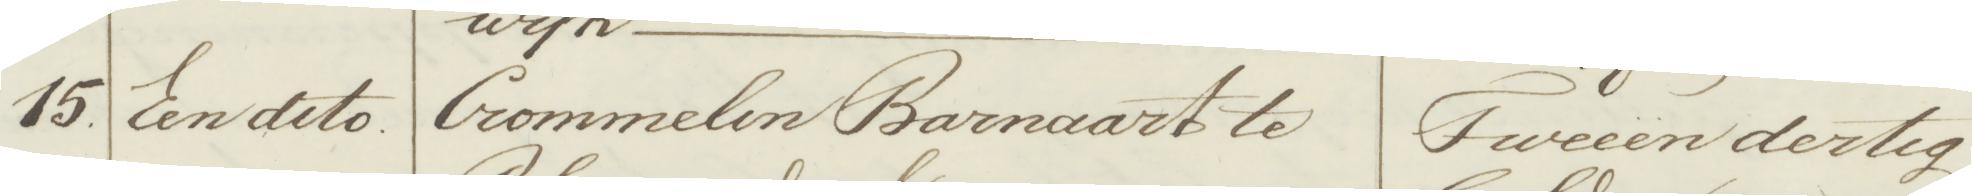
15. Een dito. Crommelin Barnaart te Tweeen dertig
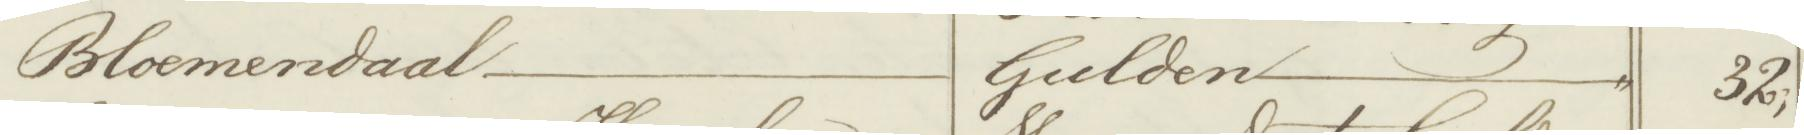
Bloemendaal Gulden „ 32;
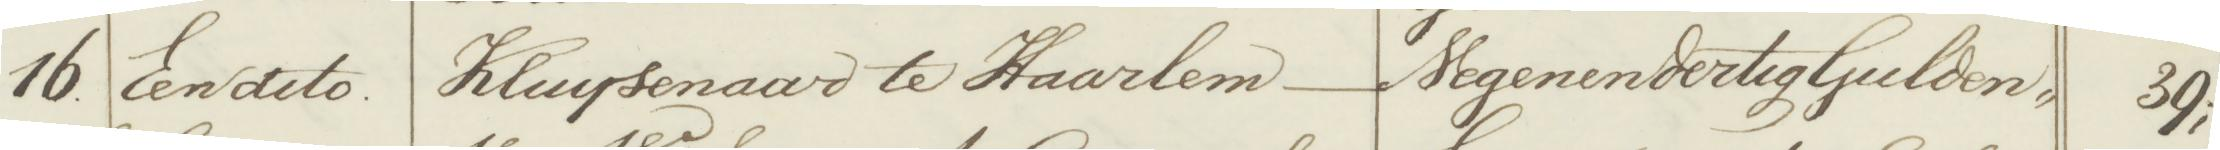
16. Een dito. Kluysenaar te Haarlem Negenendertig Gulden „ 39;
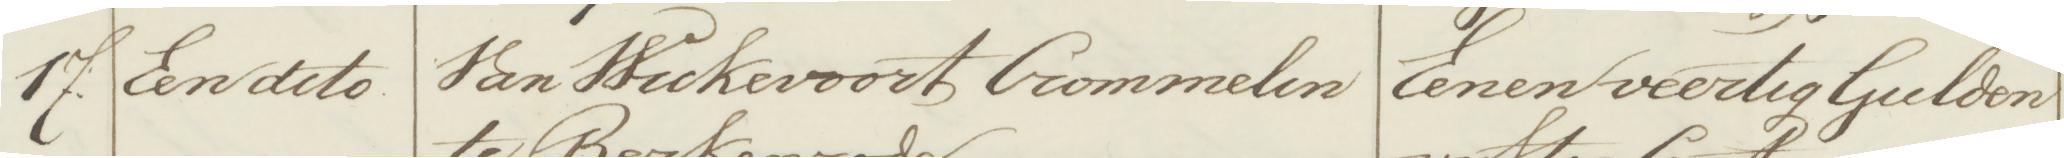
17: Een dito. Van Wickevoort Crommelin Eenen veertig Gulden
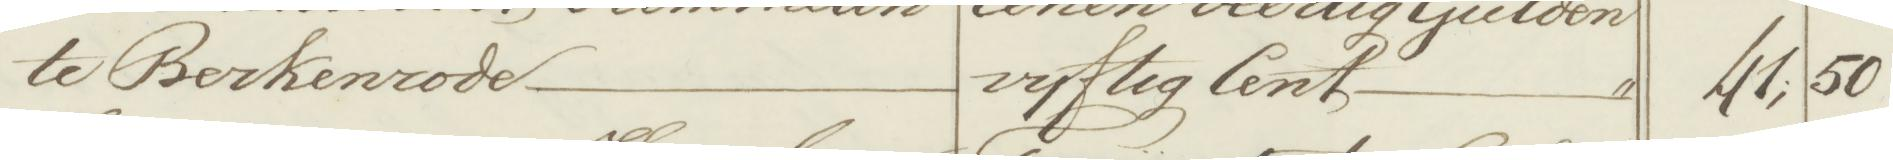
te Berkenrode vyftig Cent „ 41; 50
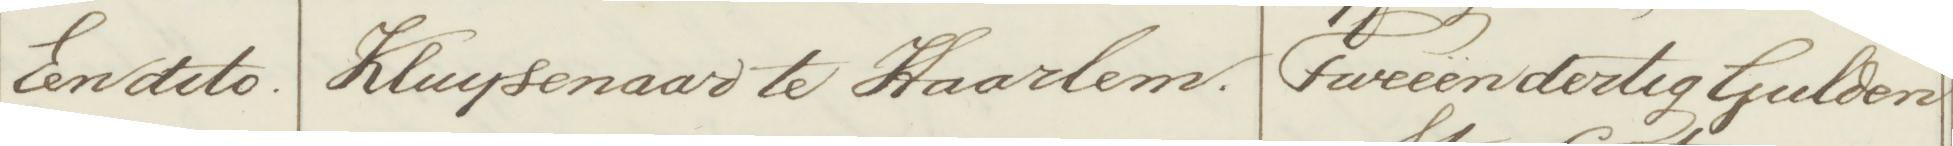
Een dito. Kluysenaar te Haarlem. Tweeën dertig Gulden
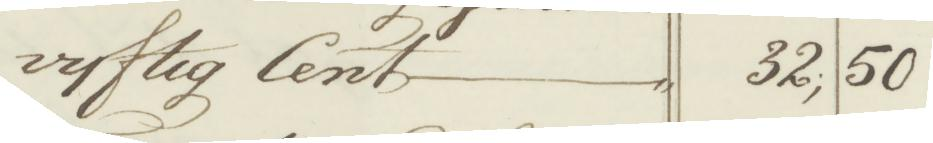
vyftig Cent „ 32; 50
